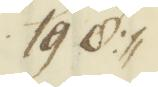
19 8:„
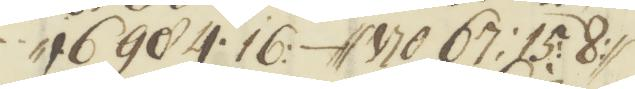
„16984.16:—„170 67:15:8:„
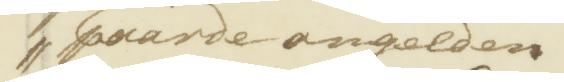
„paarde ongelden
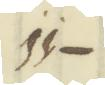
11–
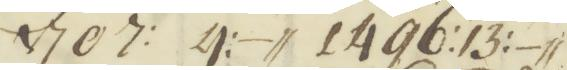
1707: 4:—„ 1496:13:–„
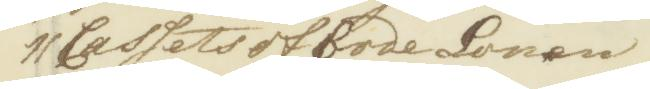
„Cassets of bode Lonen
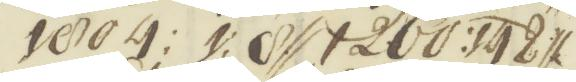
1804: 1: 8„1260:148„
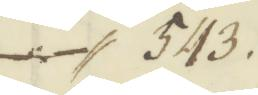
—:— 543
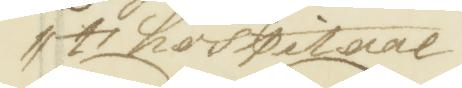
„ t' hospitaal
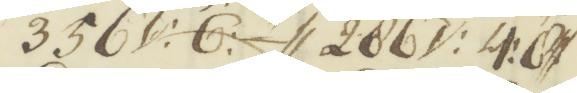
3561: 6:—„ 2861:4:8
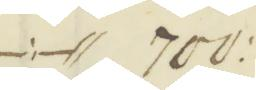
—:—„ 700:
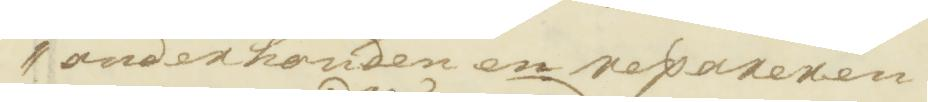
onderhouden en repareren
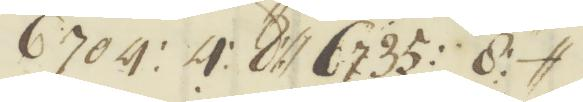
6704: 4: 8:„ 6735: 8:—„
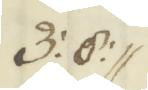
3:8:„
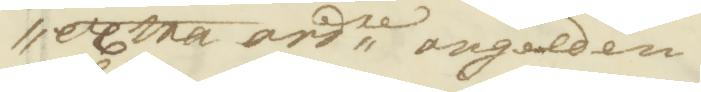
„extra ord„re ongelden
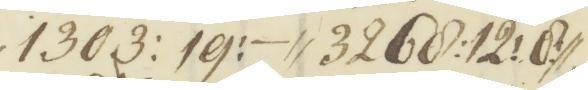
1303: 19:—„ 3268:12:8:„
